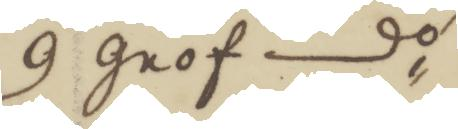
9 grof _„o
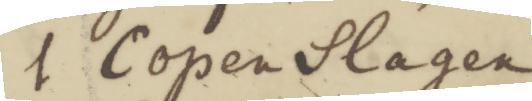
1 Coperslager
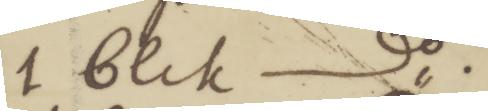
1 blik _„o
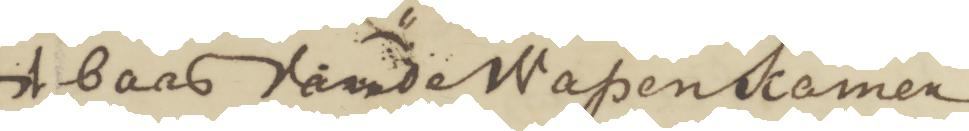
1 baas vande wapenkamer
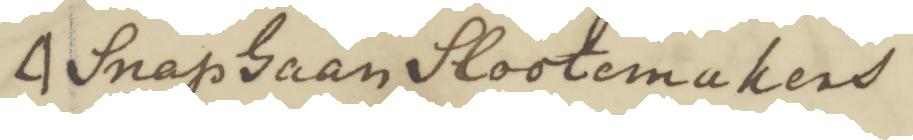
4 snaphaan slootemakers
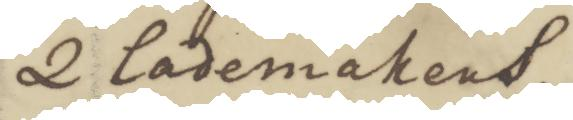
2 lademakers
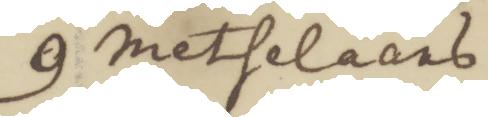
9 metselaars
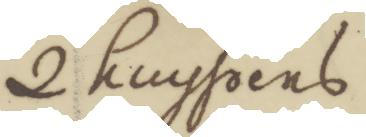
2 kuypers
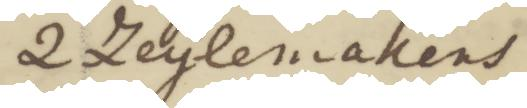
2 zeylemakers
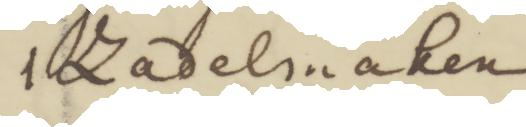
1 zadelmaker
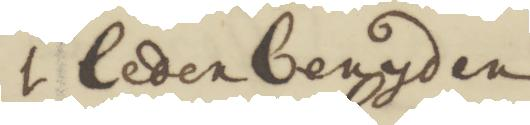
1 leder beryder
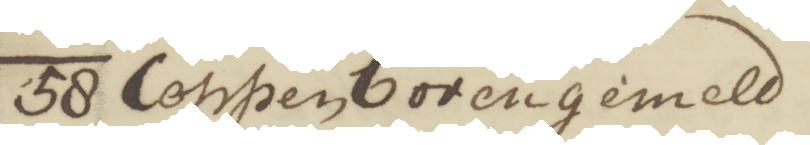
58 Coppen boven gemeld
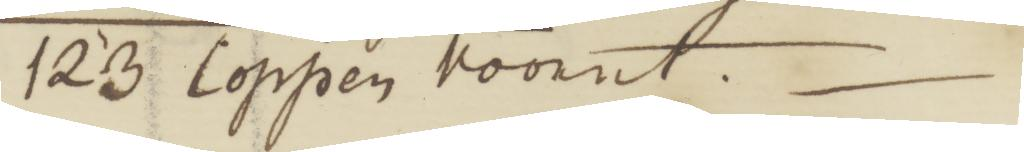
12'3 Coppen voornt. —
